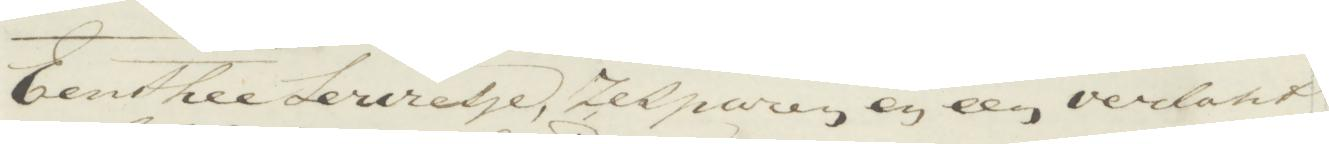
Een thee serviesje, zes paren en een verlakt
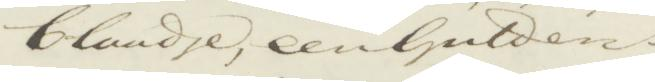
blaadje, een Gulden
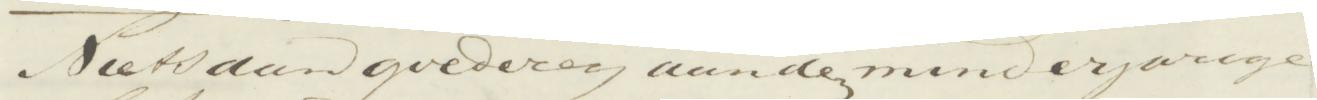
Niets aan goederen aan de minderjarige
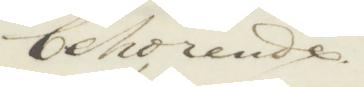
behorende.
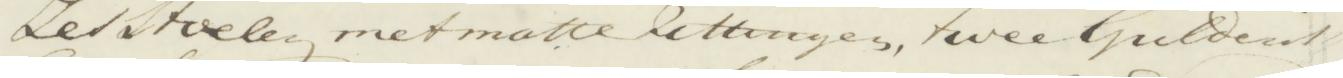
Zes stoelen met matte zittingen, twee Guldens
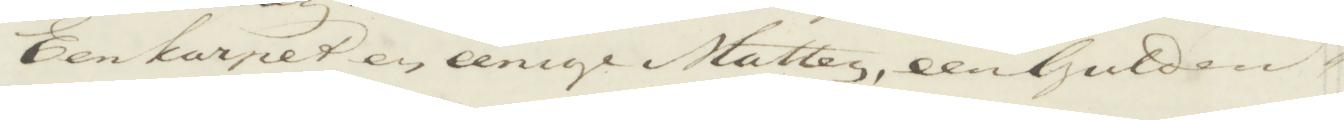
Een karpet en eenige Matten, een Gulden
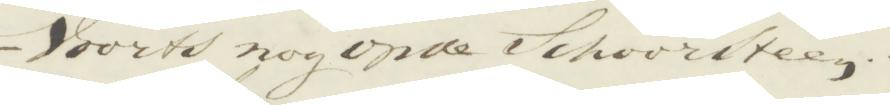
Voorts nog op de Schoorsteen.
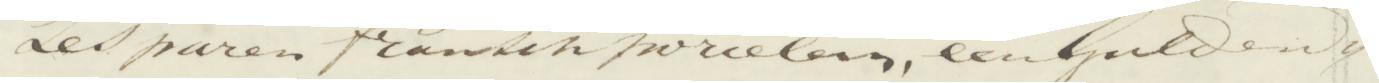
Zes paren fransch porcelein, een Gulden „
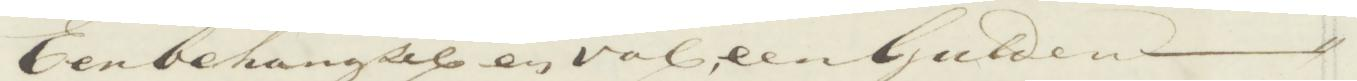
Een behangzel en val, een Gulden—„
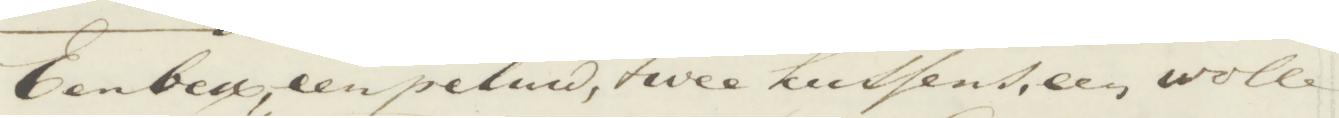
Een bed, een peluw, twee kussens, een wolle
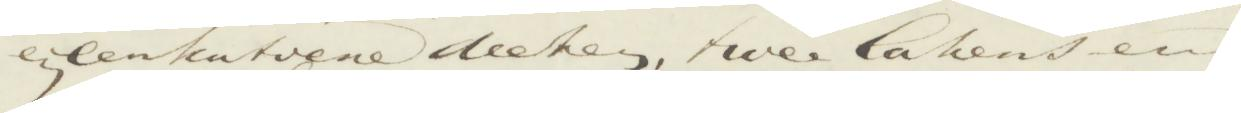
en een katoene deeken, twee lakens en
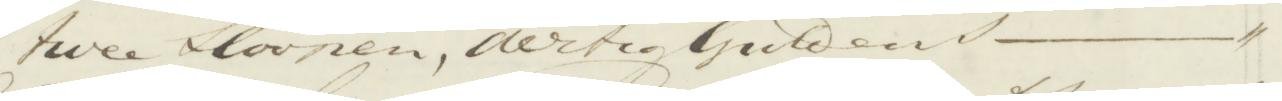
twee sloopen, dertig Guldens—„
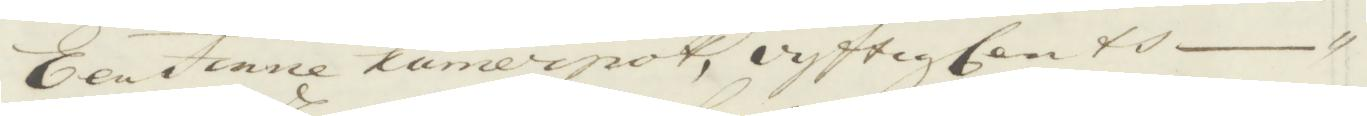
Een Tinne kamerpot, vyftig Cents
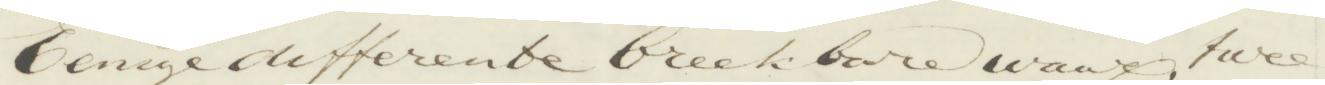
Eenige differente breekbare waar twee
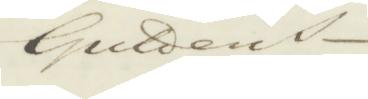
Guldens-
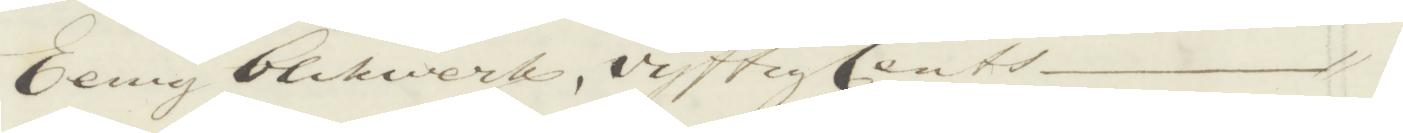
Eenig blikwerk, vyftig Cents—
